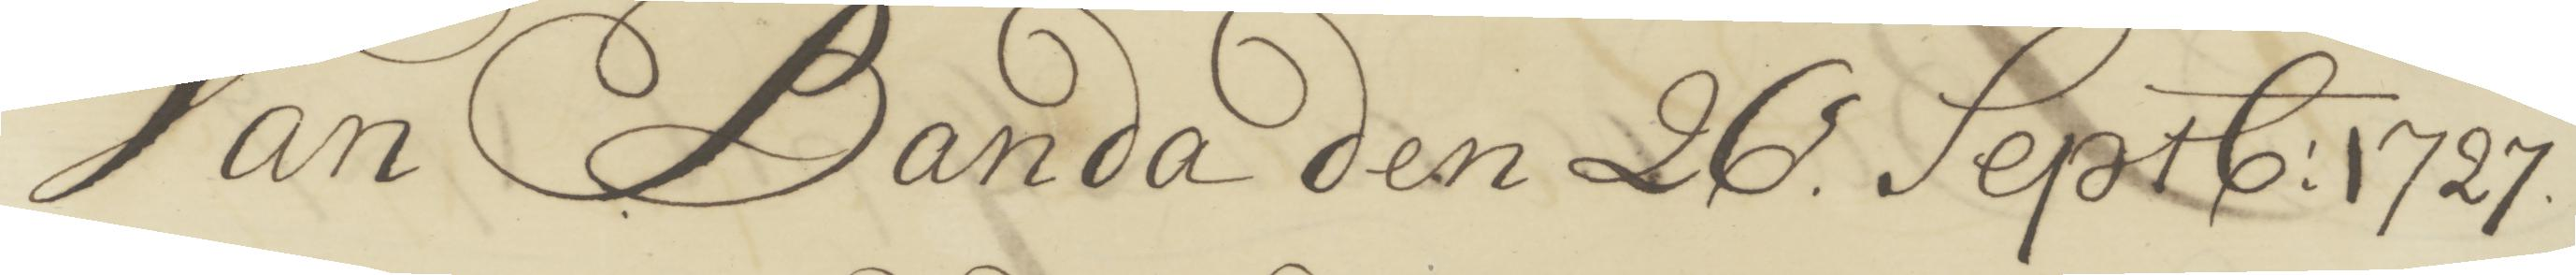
Van Banda den 26.' Septb: 1727.
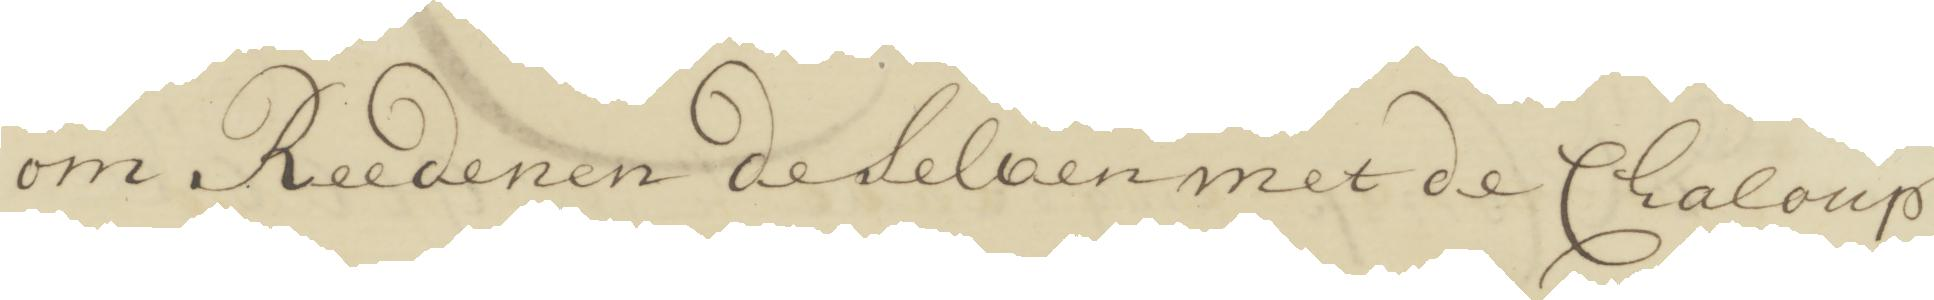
om Reedenen de selven met de Chaloup
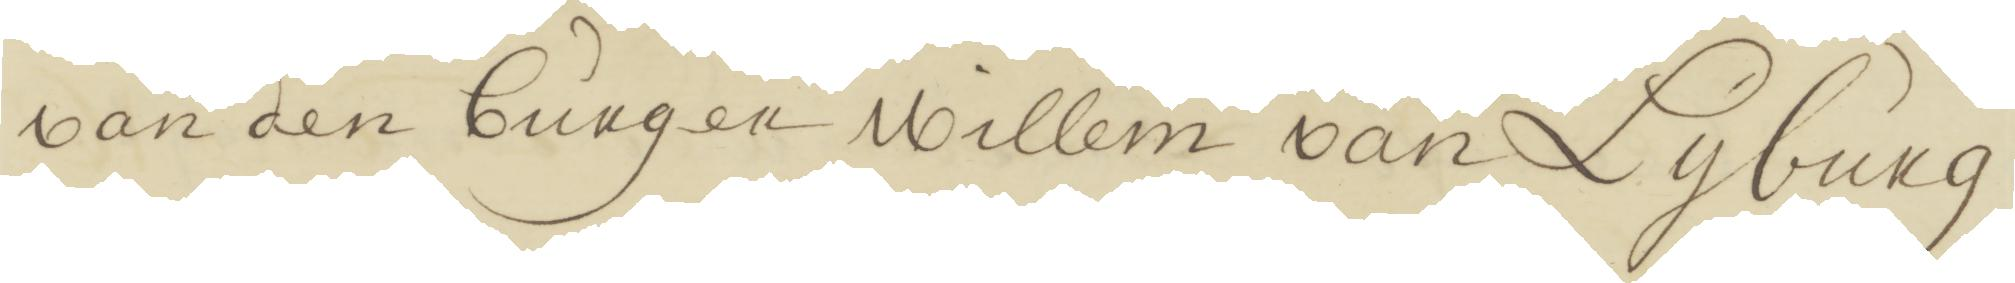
van den burger Willem van Lijburg
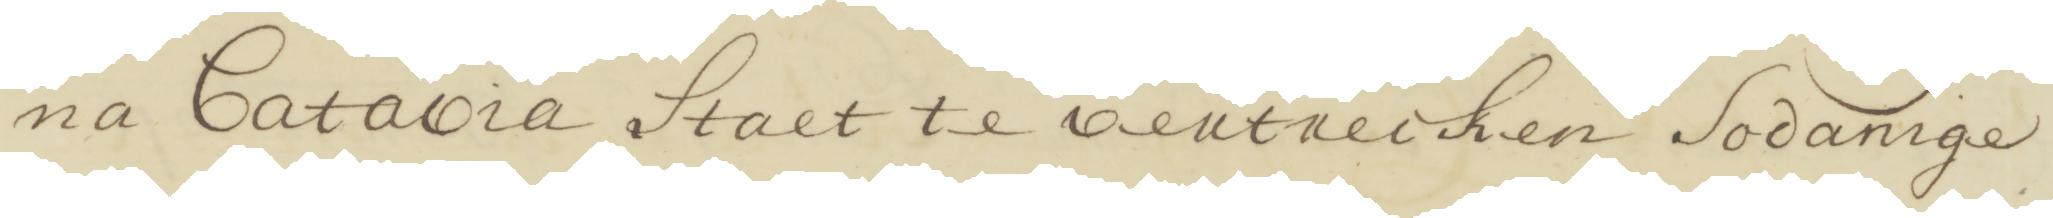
na batavia staet te vertrecken sodanige
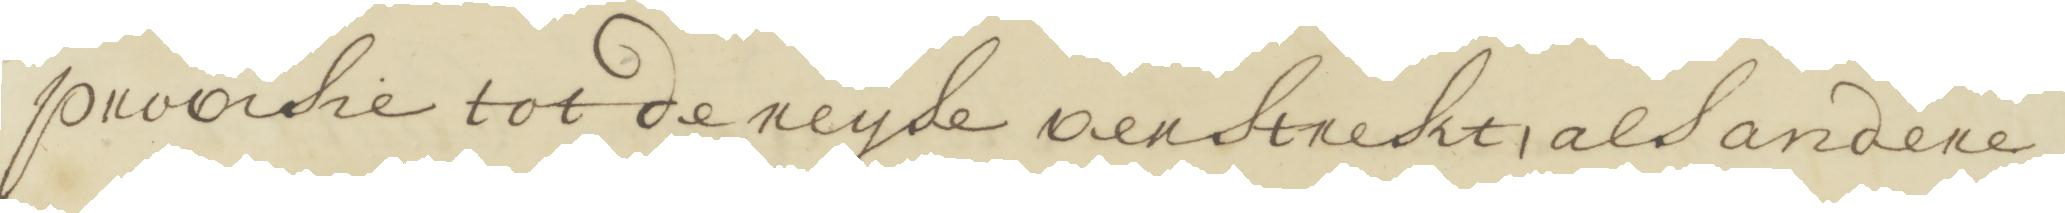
provisie tot de reijse verstrekt, als andere
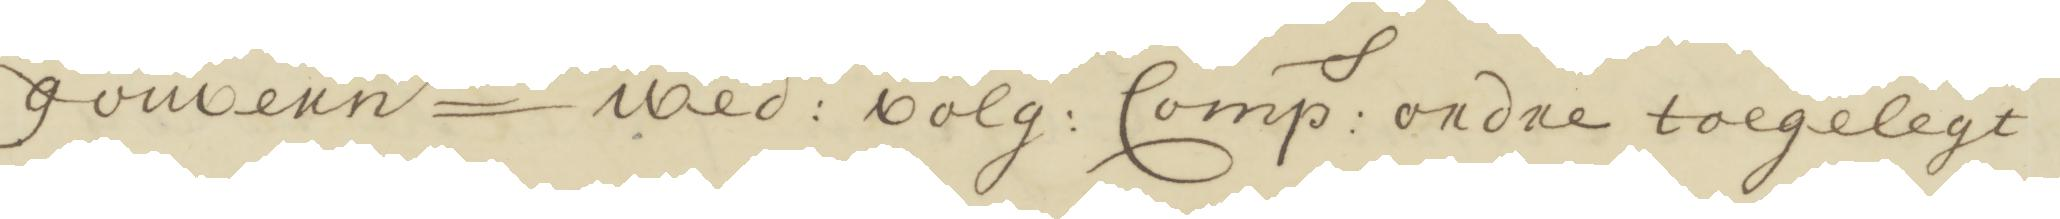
gouvern=rs wed:s volg:s Comp:s ordre toegelegt
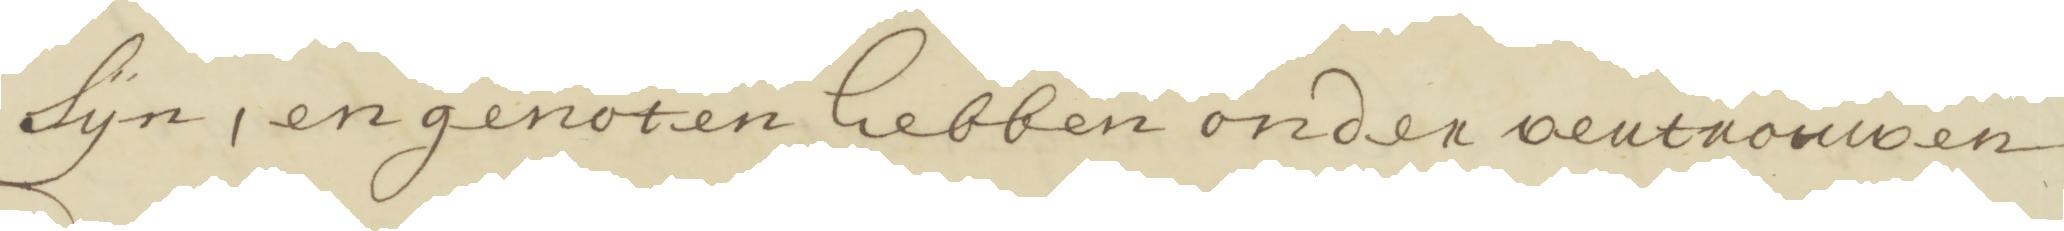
sijn, en genoten hebben onder vertrouwen
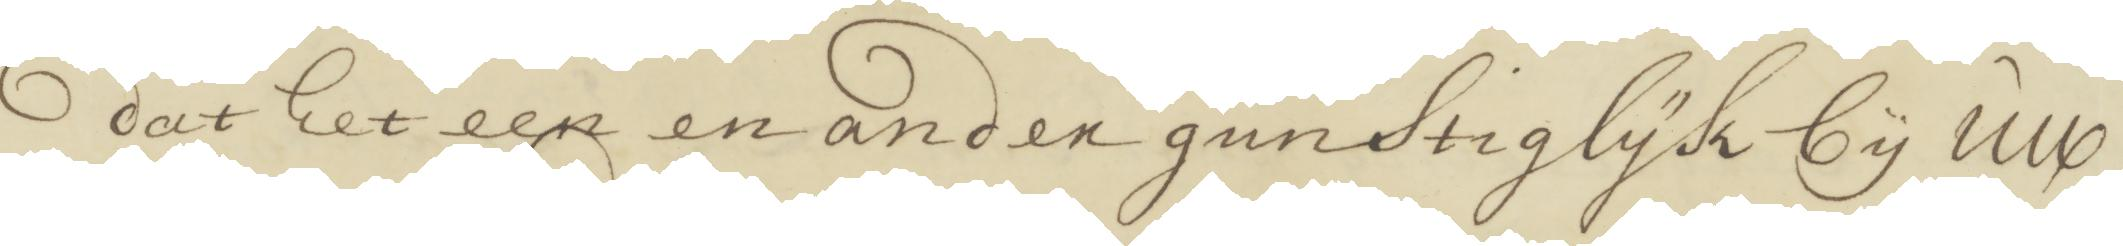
dat het een en ander gunstiglijk bij uw
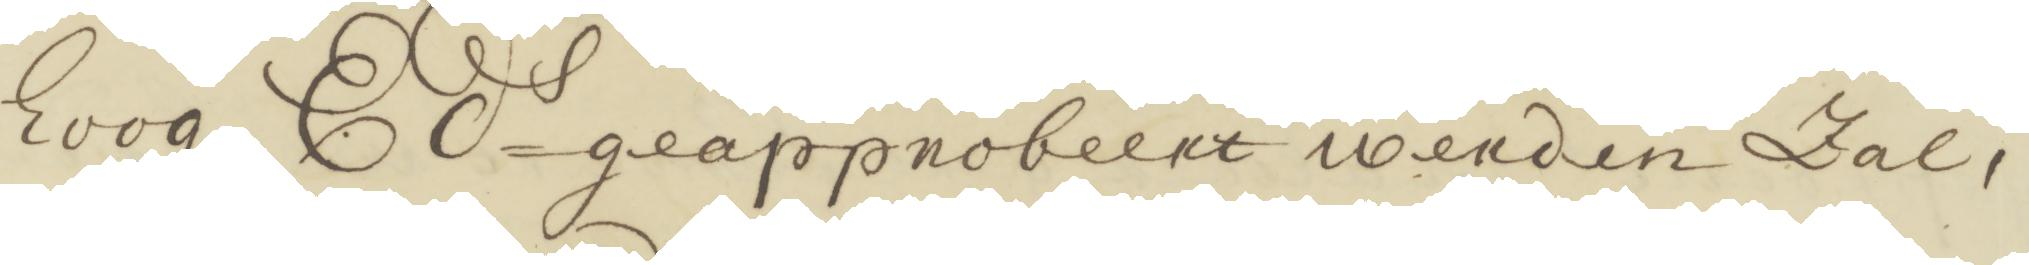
hoog Ed=s geapprobeert werden zal;
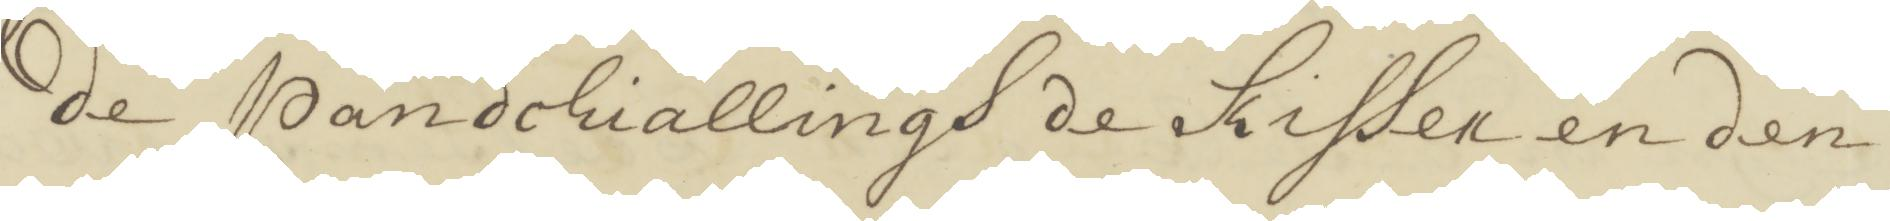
de pandchiallings de kisser en den
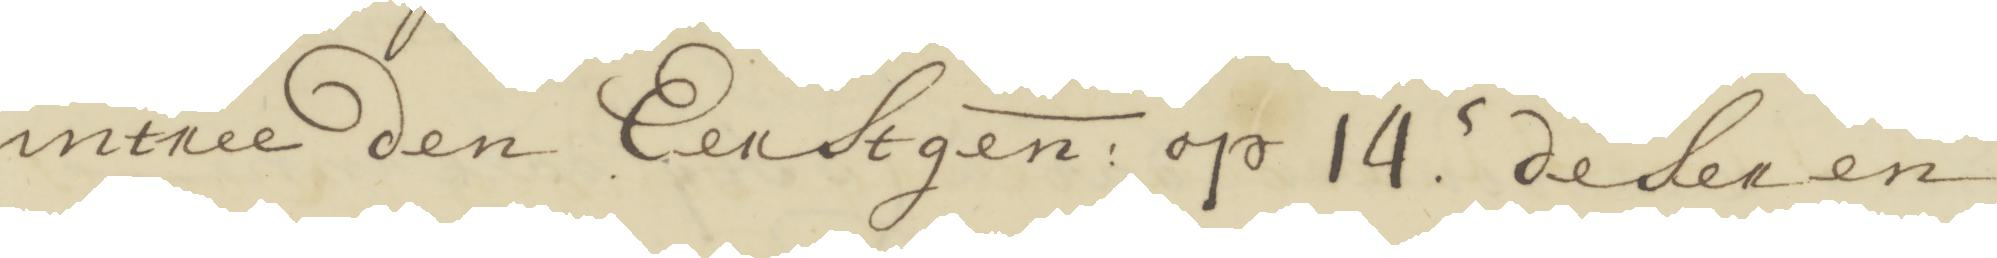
intree den Eerst gen: op 14.' deser en
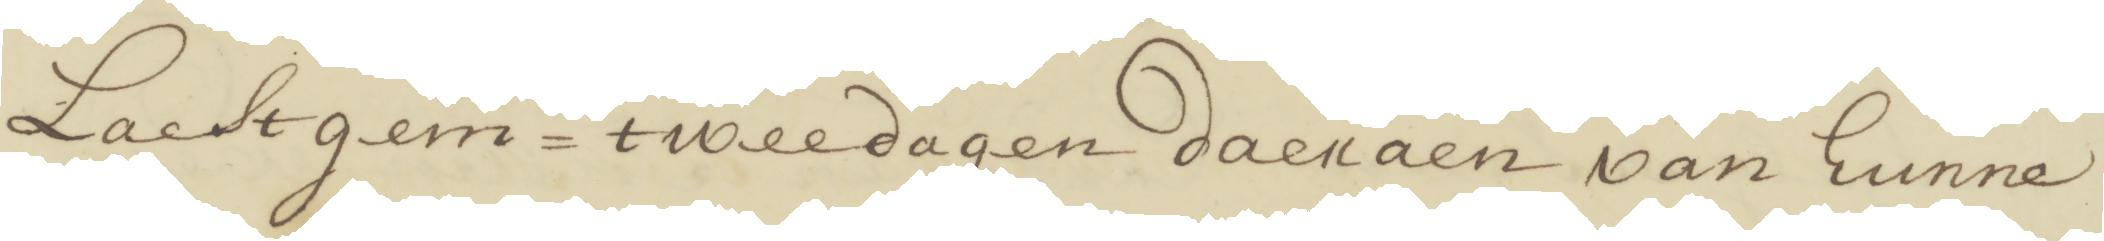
Laest gem=te twee dagen daeraen van hunne
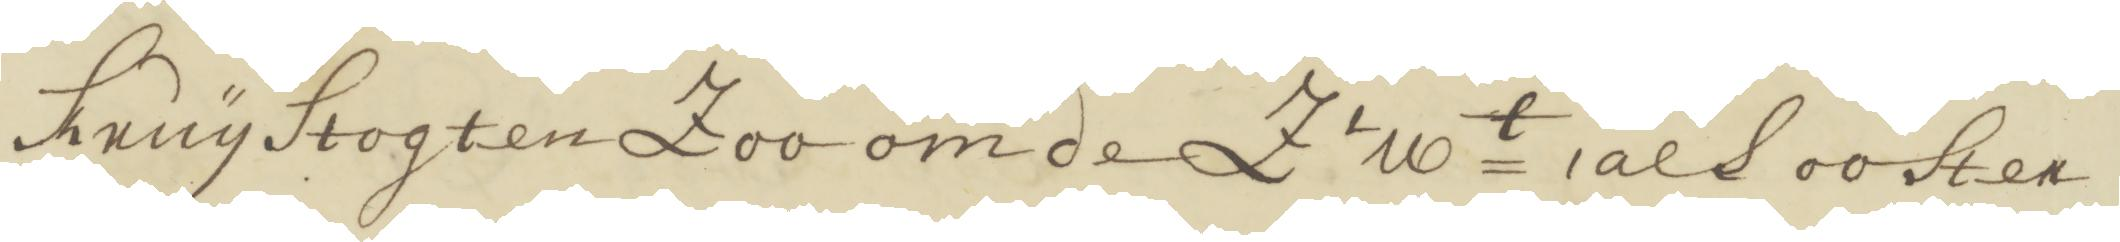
kruijstogten zoo om de Zt w=t, als ooster
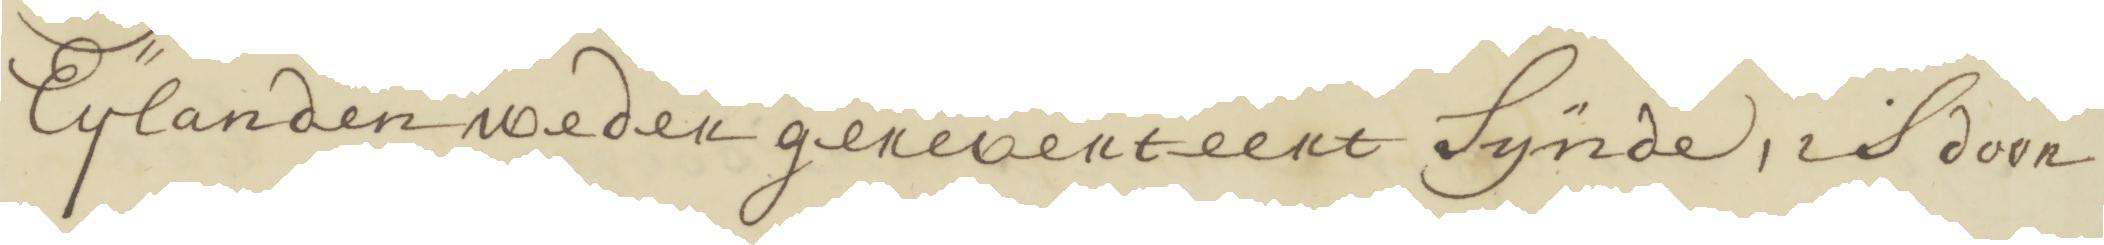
Eijlanden weder gereverteert sijnde, is door
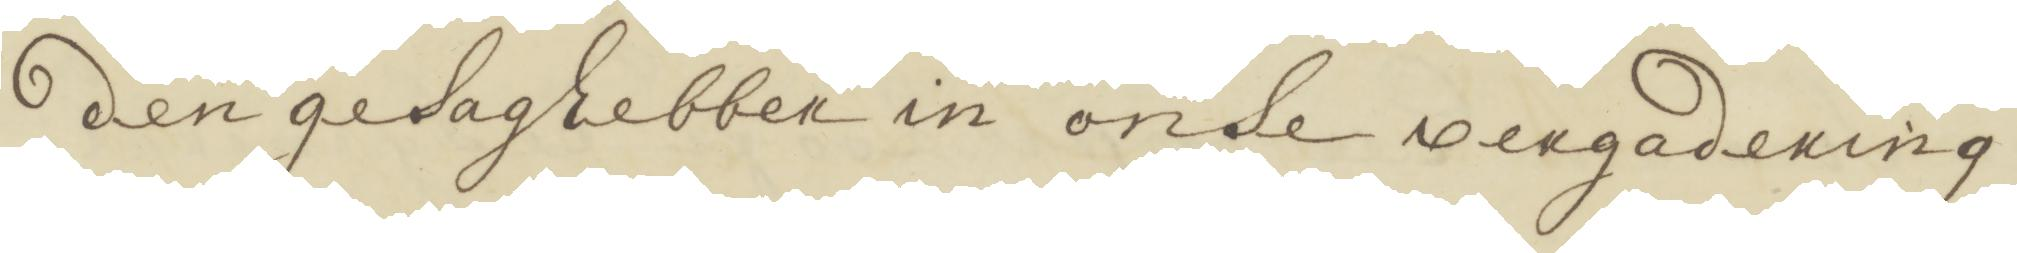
den gesaghebber in onse vergadering
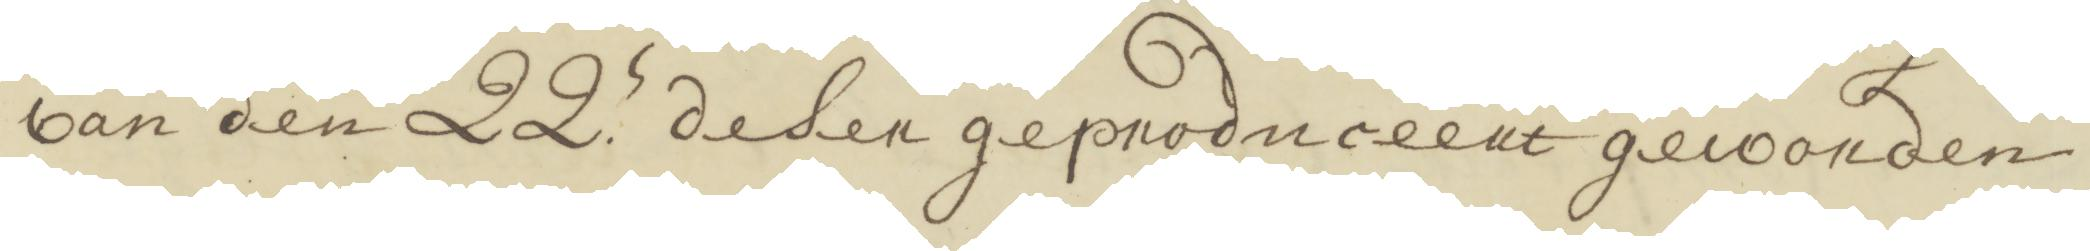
van den 22.' deser geproduceert geworden
